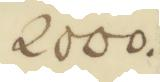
2000.
